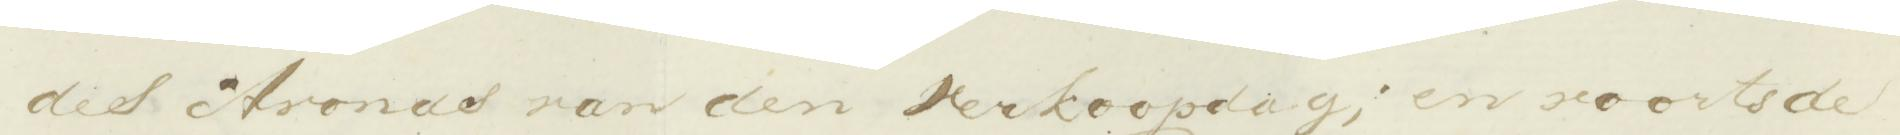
des Avonds van den verkoopdag; en voorts de
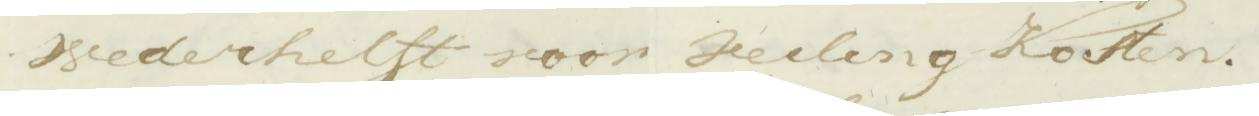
wederhelft voor veiling Kosten.
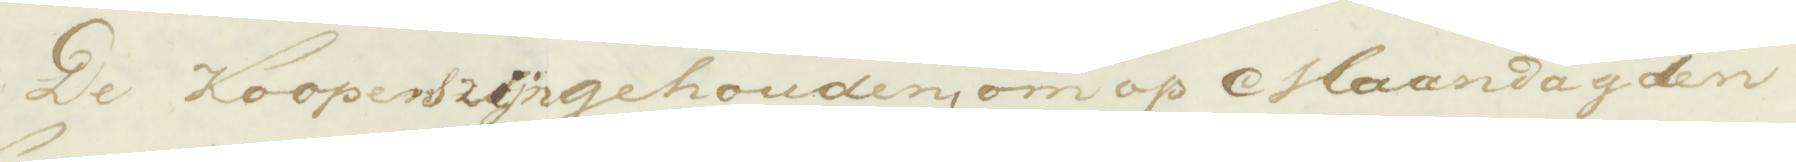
De Koopers zijn gehouden, om op Maandag den
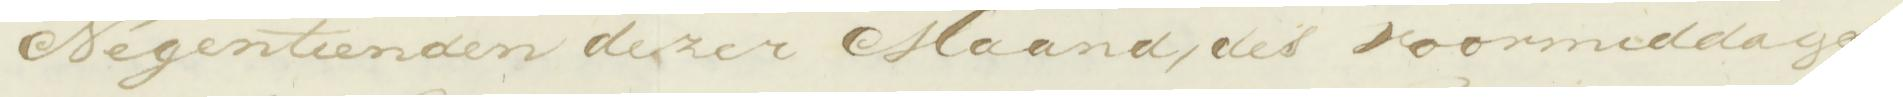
Negentienden dezer Maand, des voormiddags
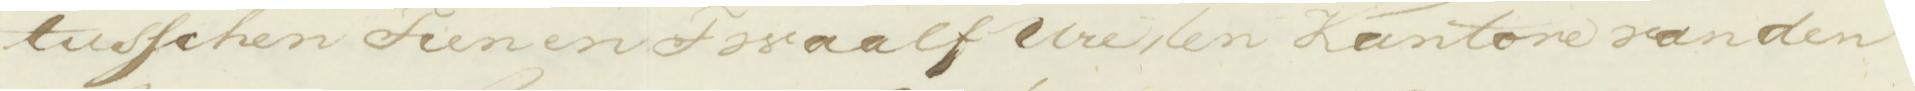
tusschen Tien en Twaalf ure, ten kantore van den
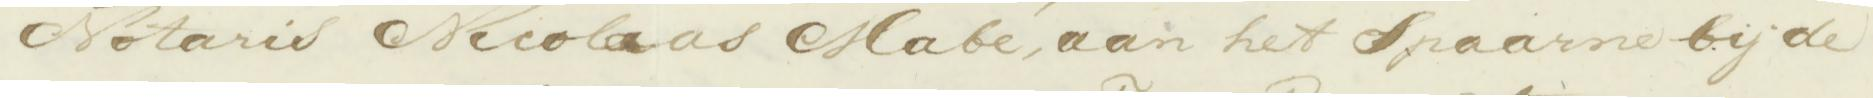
Notaris Nicolaas Mabé, aan het Spaarne bij de
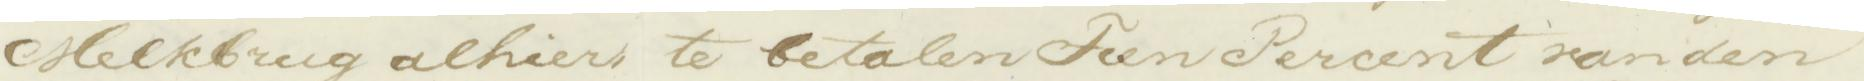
Melkbrug alhier, te betalen Tien Percent van den
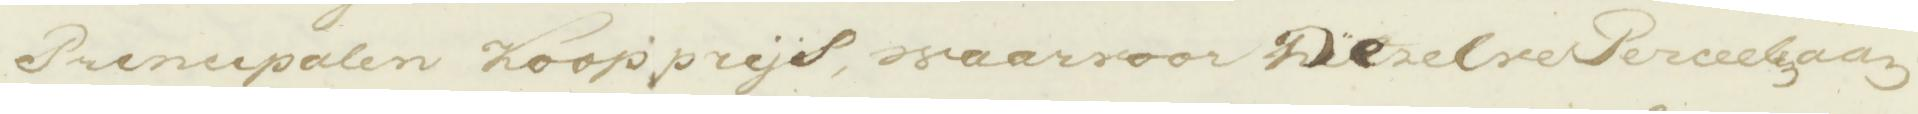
Principalen Koop prijs, waarvoor Dezelve Perceelen aan
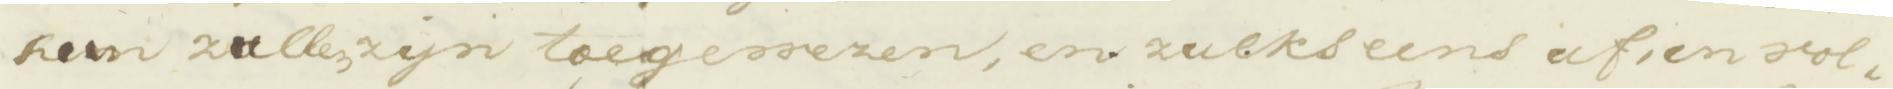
hem zullen zijn toegewezen, en zulks eens af, in vol„
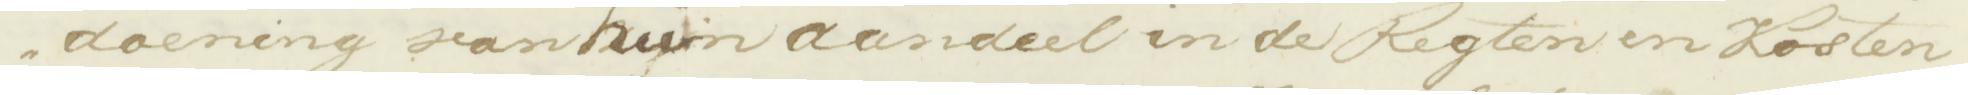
„doening van hun aandeel in de Regten en Kosten
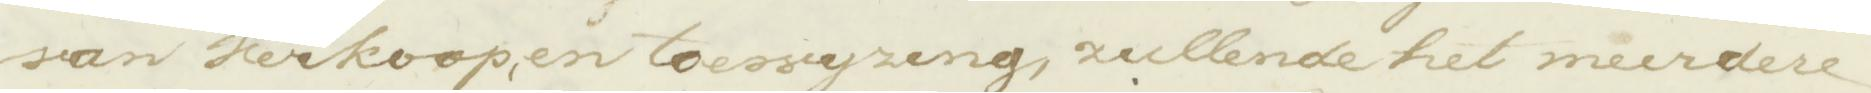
van verkoop, en toewyzing, zullende het meerdere
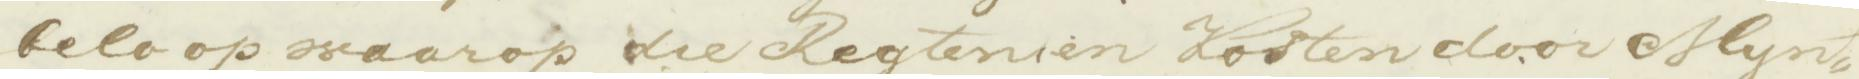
beloop waarop die Regten en Kosten door Myn„
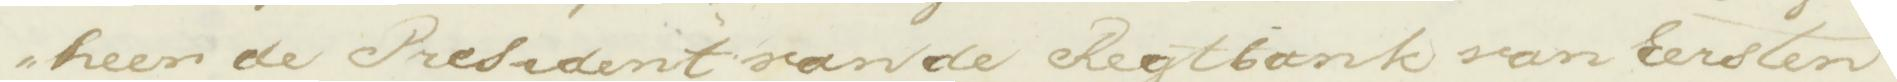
„heer de President van de Regtbank van Eersten
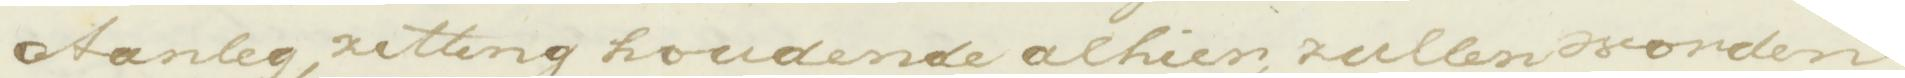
Aanleg, zitting houdende alhier, zullen worden
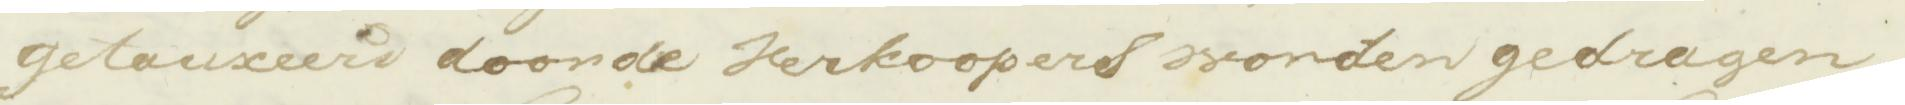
getauxeerd door de verkoopers worden gedragen,
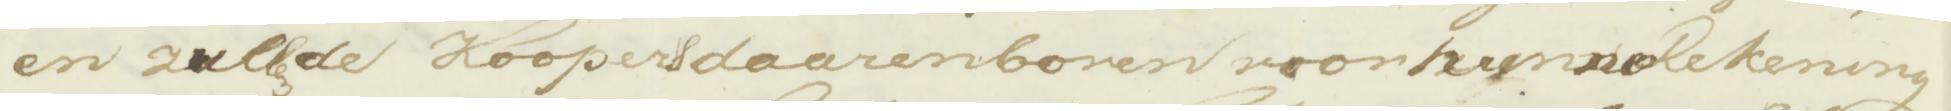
en zullen de koopers daarenboven voor hun reekening
